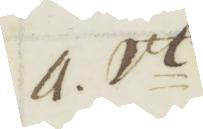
4. v=t
